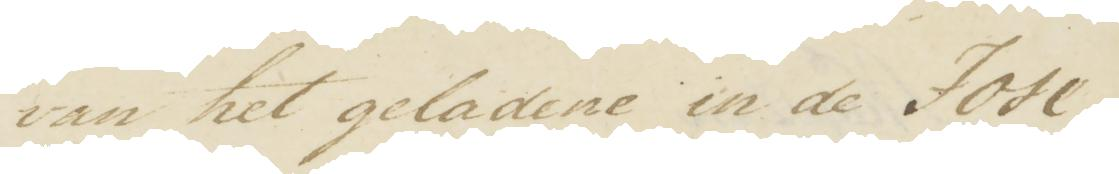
van het geladene in de Jose
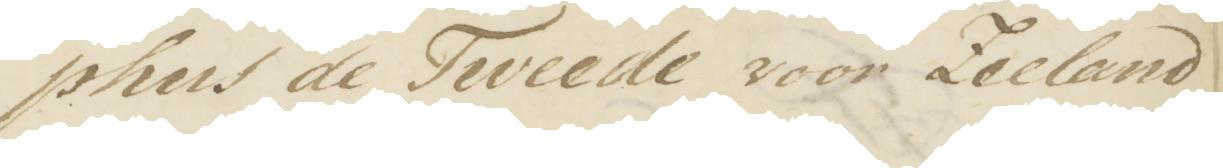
phus de Rweede voor Zeeland
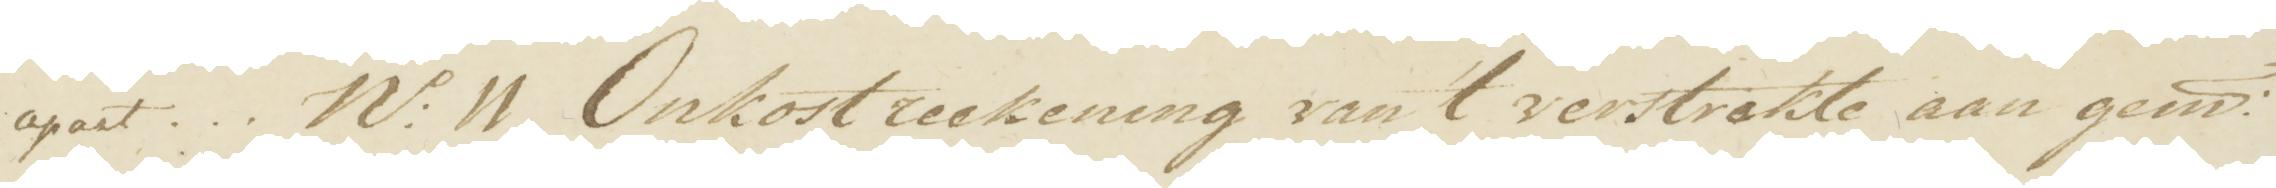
apart - - - N:o 11 Onkostreekening van ’t verstrekte aan gem:
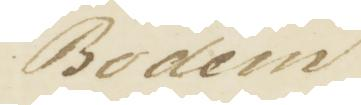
Bodem
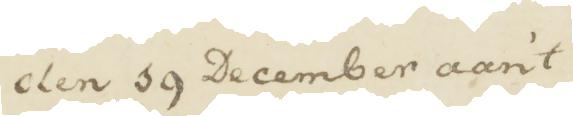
den 19 december aan ’t
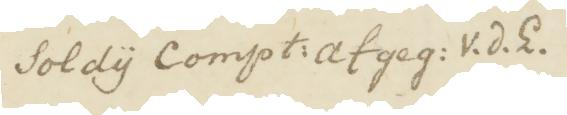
soldij Compt: afgeg: V.d.L.
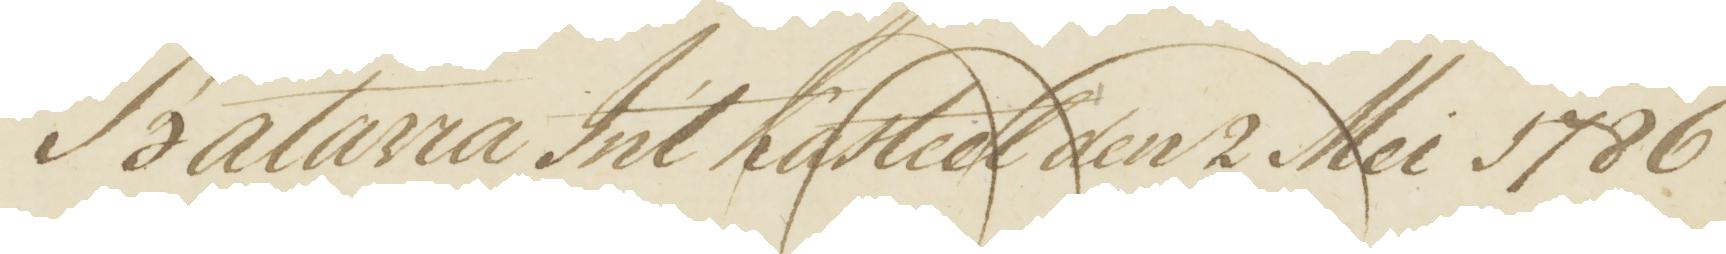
Batavia In’t Casteel den 2 Mei 1786.
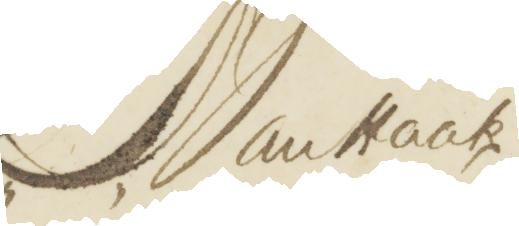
Van Kaak
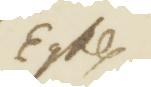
Egter
